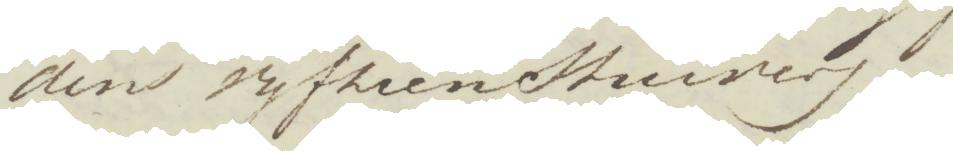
dens vyftien stuivers . .
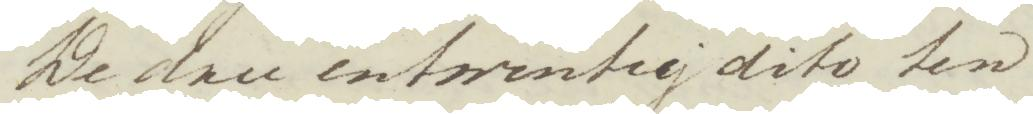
De drie en twintig dito ten
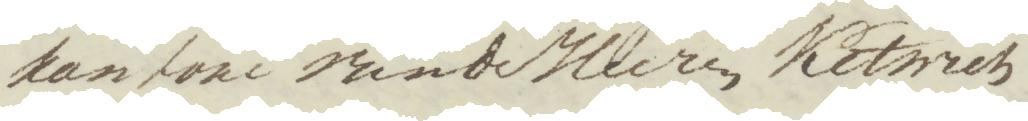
kan tore vande Heeren Ketwich
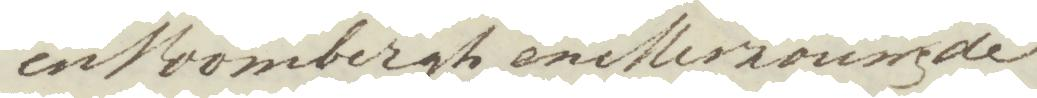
en Voombergh en Mevrouw de
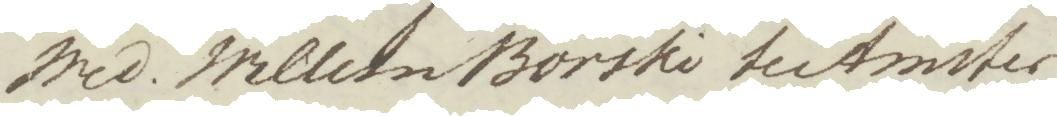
Wed. Willem Borski te Amster
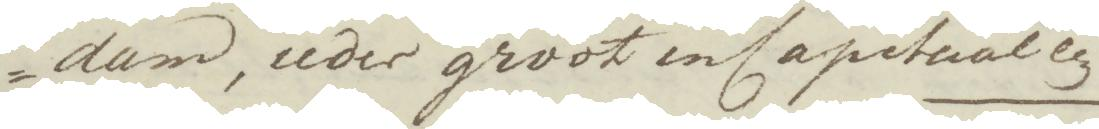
=dam, ieder groot in Capitaal een
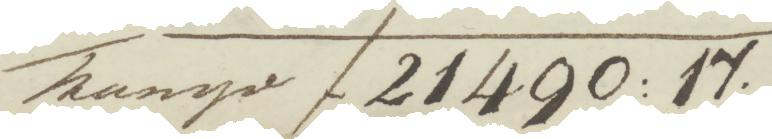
Transpt ƒ 21490: 17.
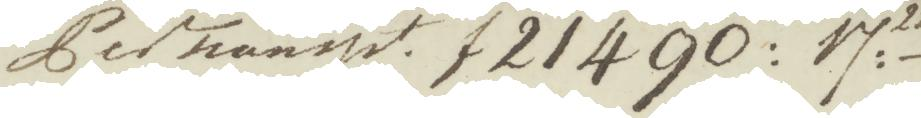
Per Transp.t ƒ 21490: 17: 22—
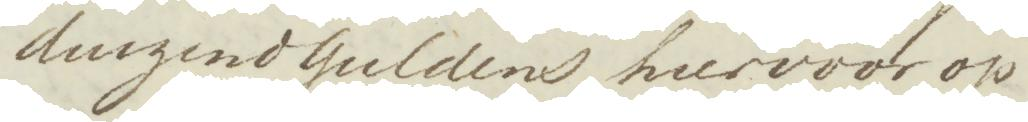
duizend Guldens hiervoor op
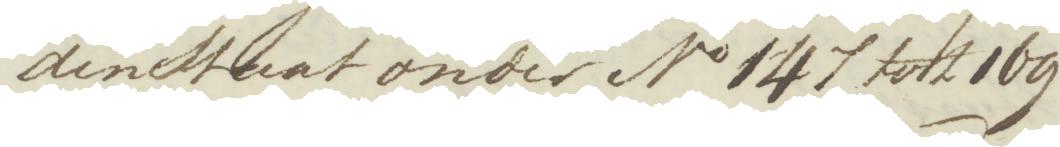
den staat onder No 147 tot 169
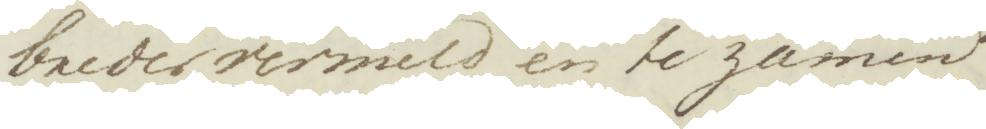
breder vermeld en te zamen
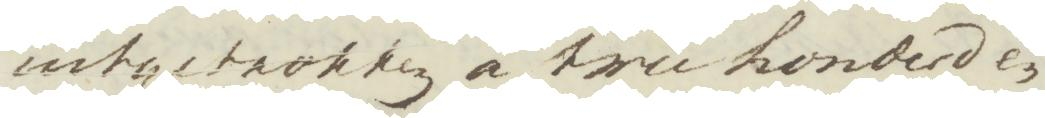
uitgetrokken a twee honderd en
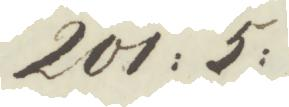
201: 5:
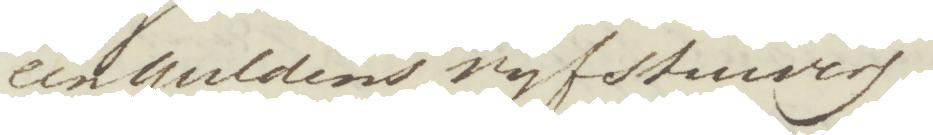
een Guldens vyf stuivers
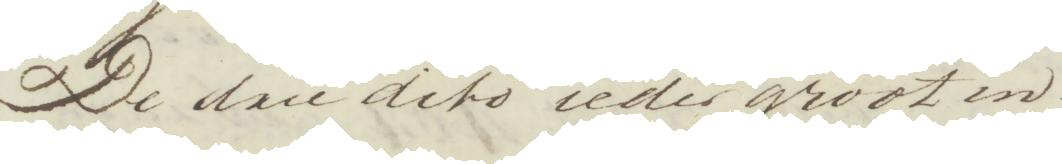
De drie dito ieder groot in
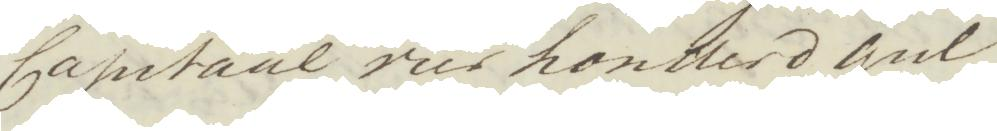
Capitaal vier honderd gul
